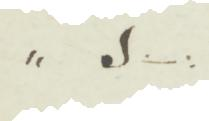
„ 1 —:
